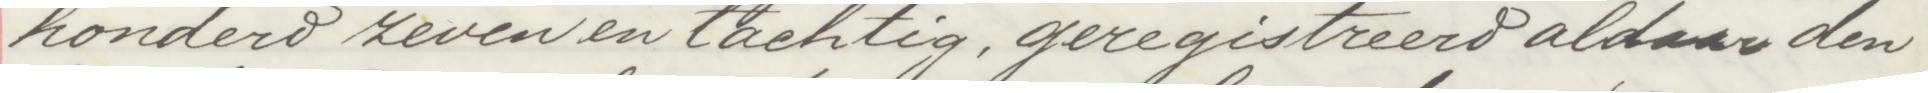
honderd zeven en tachtig, geregistreerd aldaar den
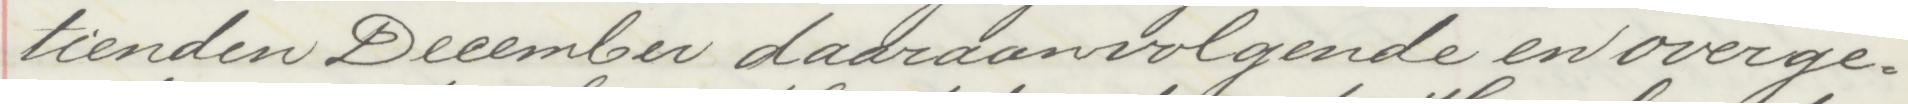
tienden December daaraanvolgende en overge=
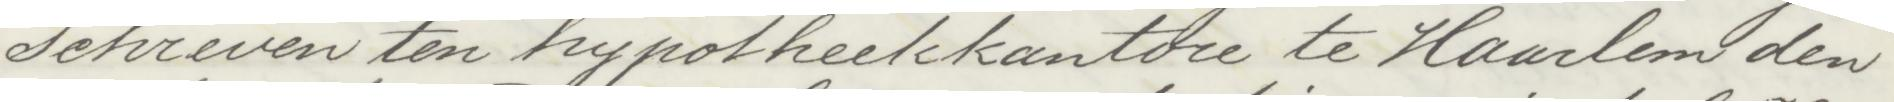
schreven ten hypotheekkantore te Haarlem den
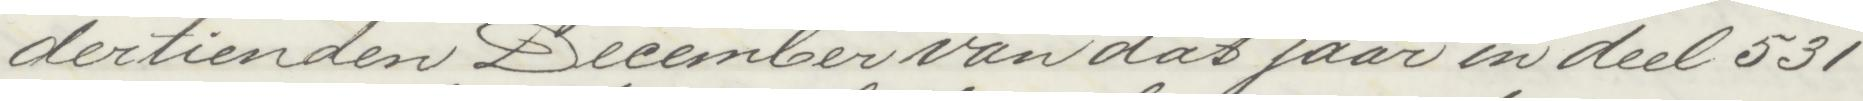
dertienden December van dat jaar in deel 531
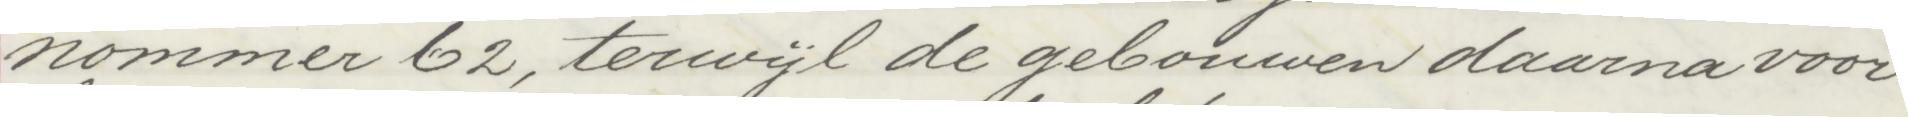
nommer 62, terwijl de gebouwen daarna voor
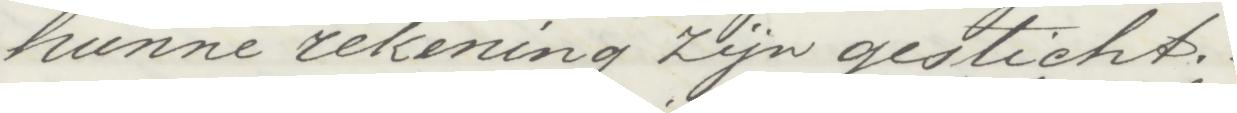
hunne rekening zijn gesticht.
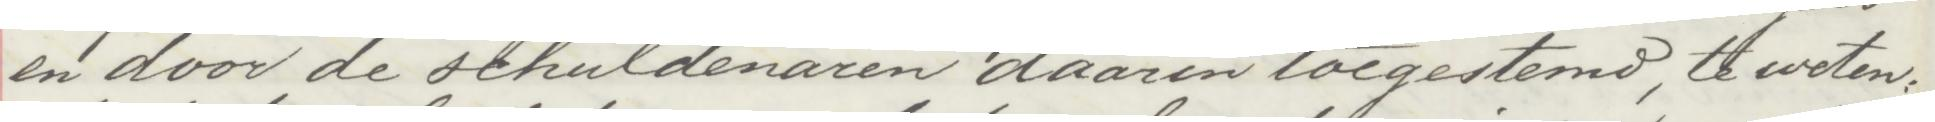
en door de schuldenaren daarin toegestemd, te weten,
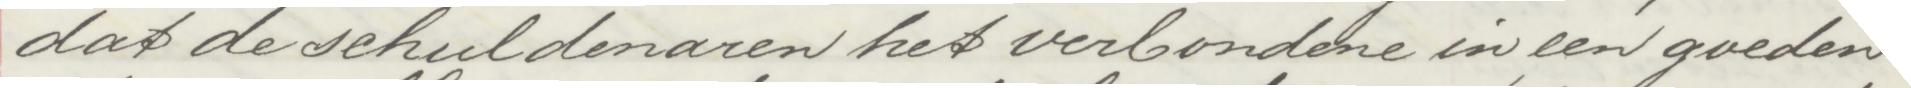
dat de schuldenaren het verbondene in een goeden
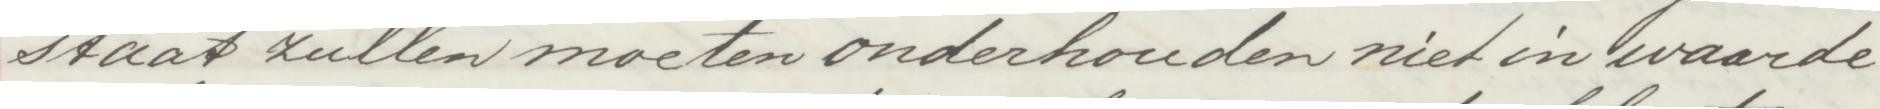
staat zullen moeten onderhouden niet in waarde
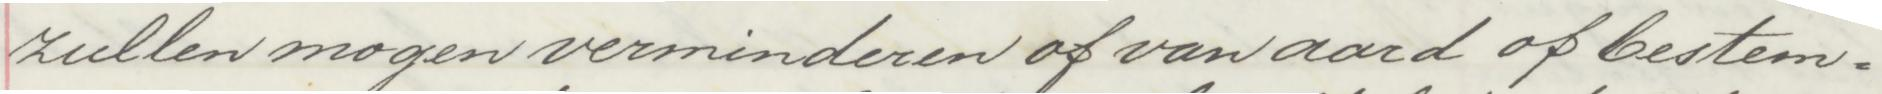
zullen mogen verminderen of van aard of bestem=
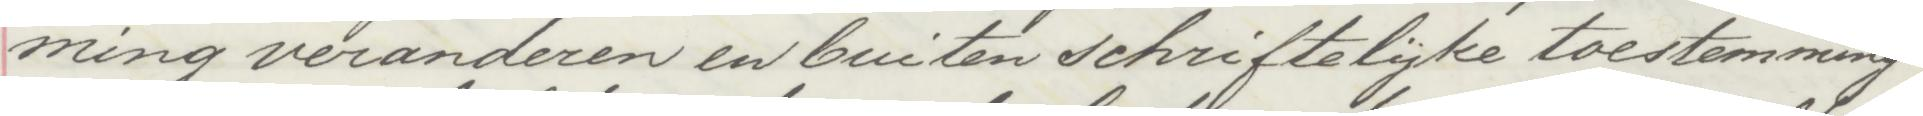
ming veranderen en buiten schriftelijke toestemming
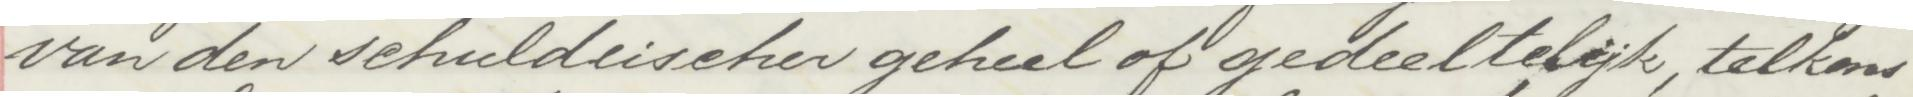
van den schuldeischer geheel of gedeeltelijk telkens
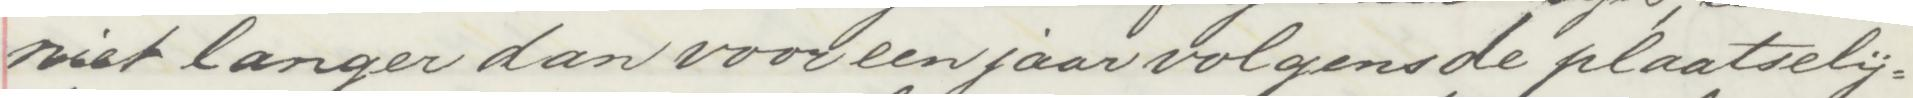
niet langer dan voor een jaar volgens de plaatselij=
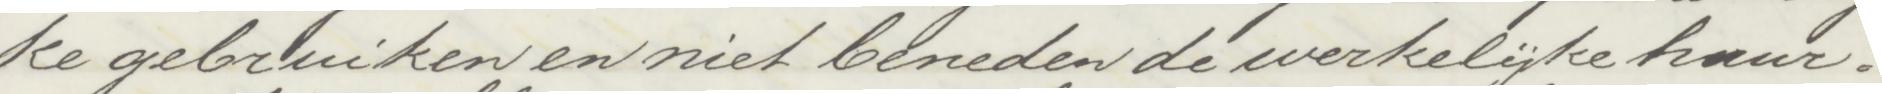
ke gebruiken en niet beneden de werkelijke huur=
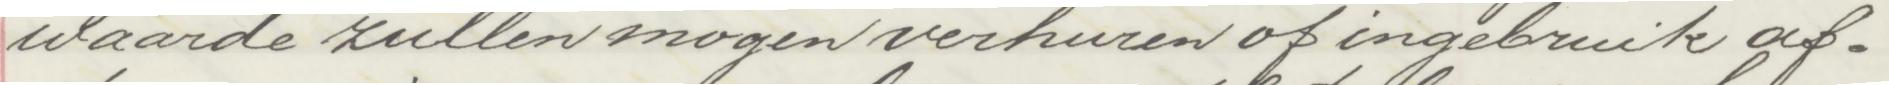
waarde zullen mogen verhuren of ingebruik af=
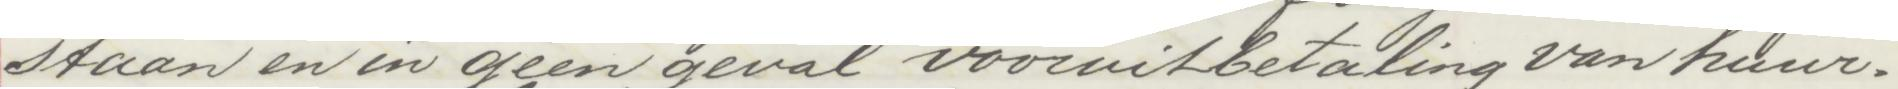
staan en in geen geval vooruitbetaling van huur=
